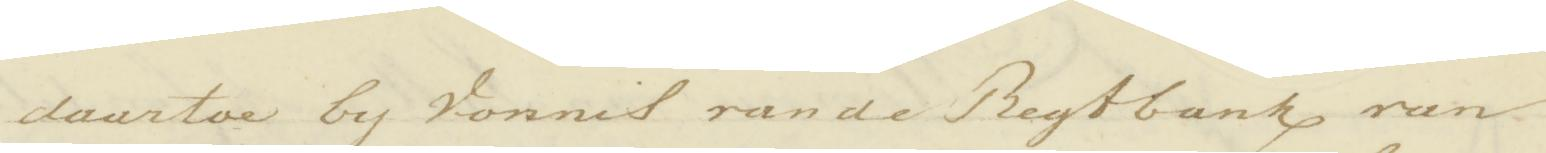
daartoe by Vonnis van de Regtbank van
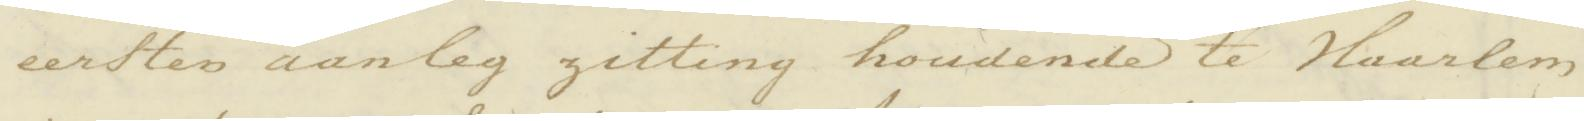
eersten aanleg zitting houdende te Haarlem
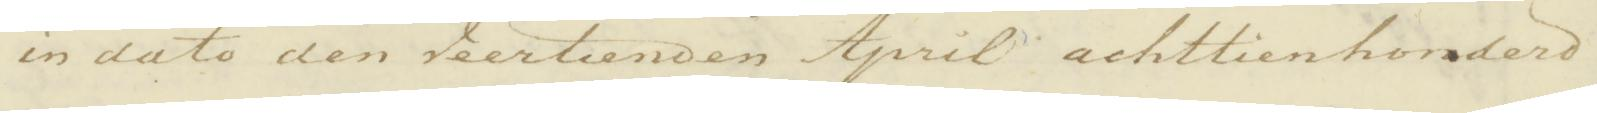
in dato den Veertienden April achttienhonderd
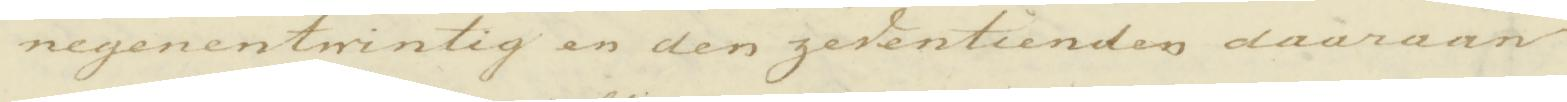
negenentwintig en den zeventiende daaraan
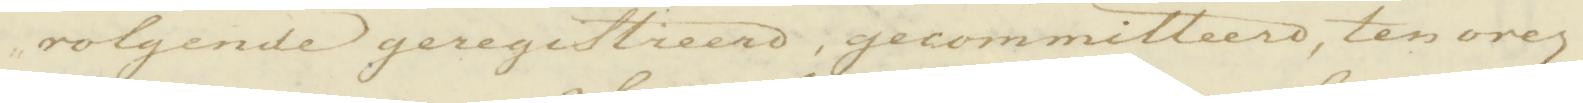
„volgende geregistreerd, gecommitteerd, ten over
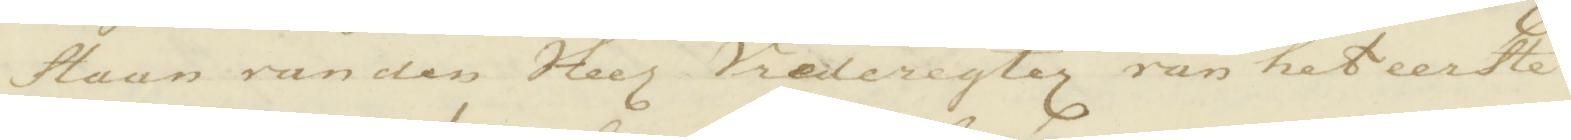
Staan van den Heer Vrederegter van het eerste
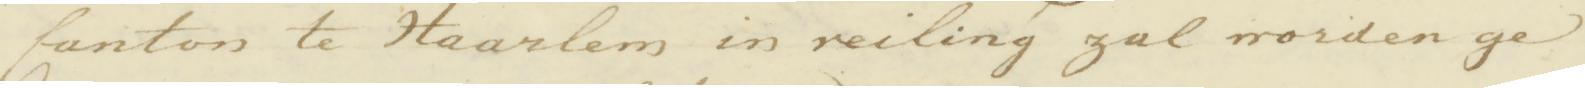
Canton te Haarlem in veiling zal worden ge
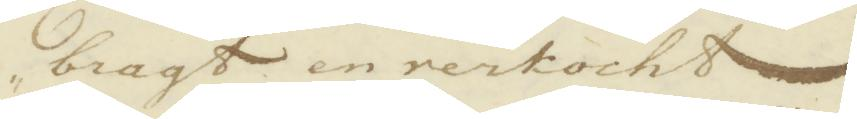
„bragt en verkocht
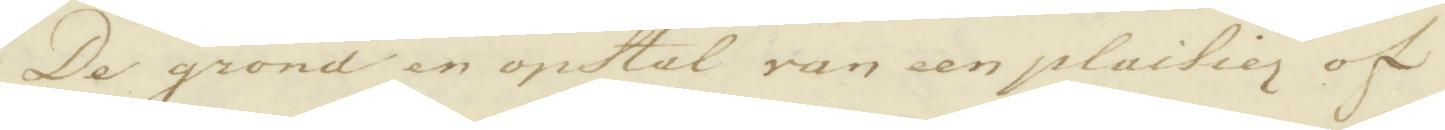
De grond en opstal van een plaisier of
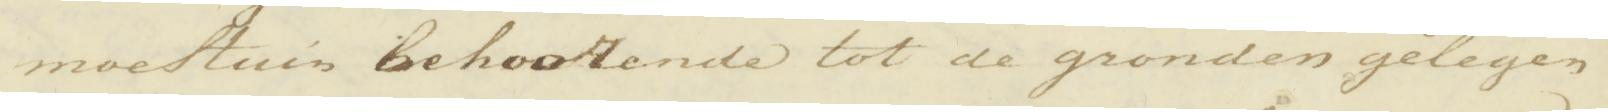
moestuin behoorende tot de gronden gelegen
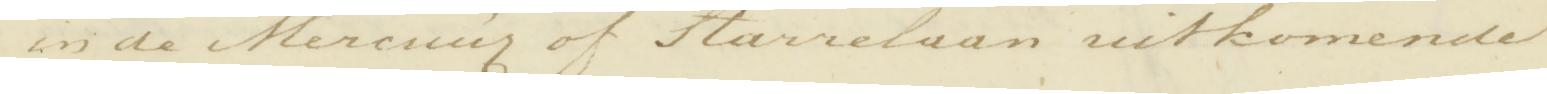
in de Mercuur of Starrelaan uitkomende
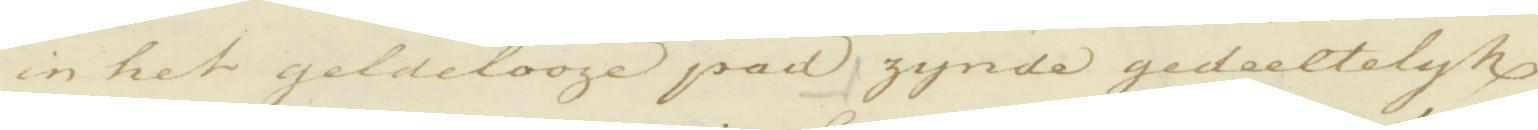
in het geldelooze pad zynde gedeeltelyk
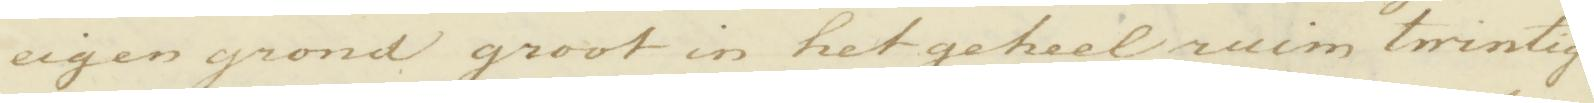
eigen grond groot in het geheel ruim twintig
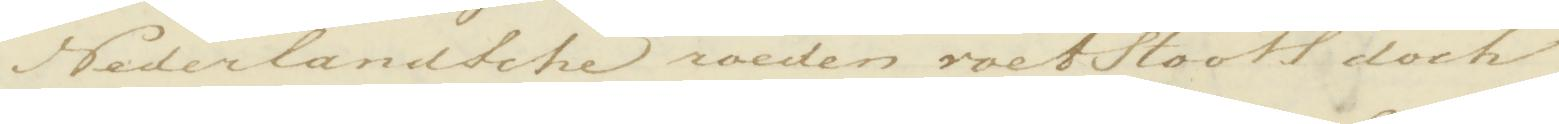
Nederlandsche roeden voetstoots doch
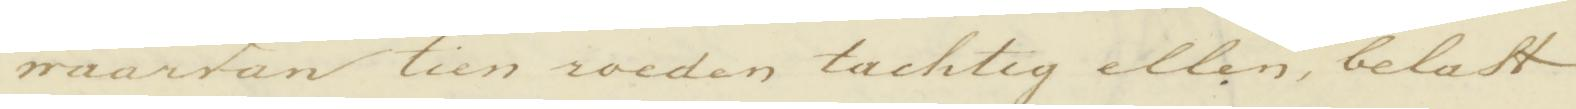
waarvan tien roeden tachtig ellen, belast
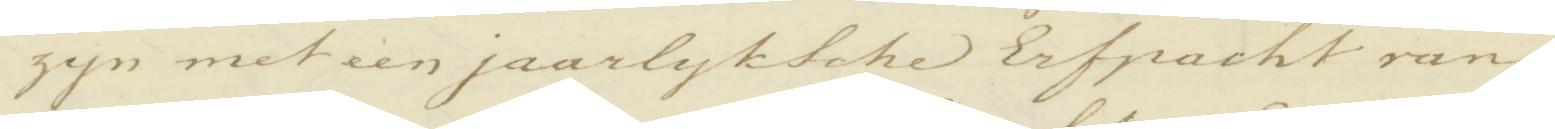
zyn met een jaarlyksche Erfpacht van
